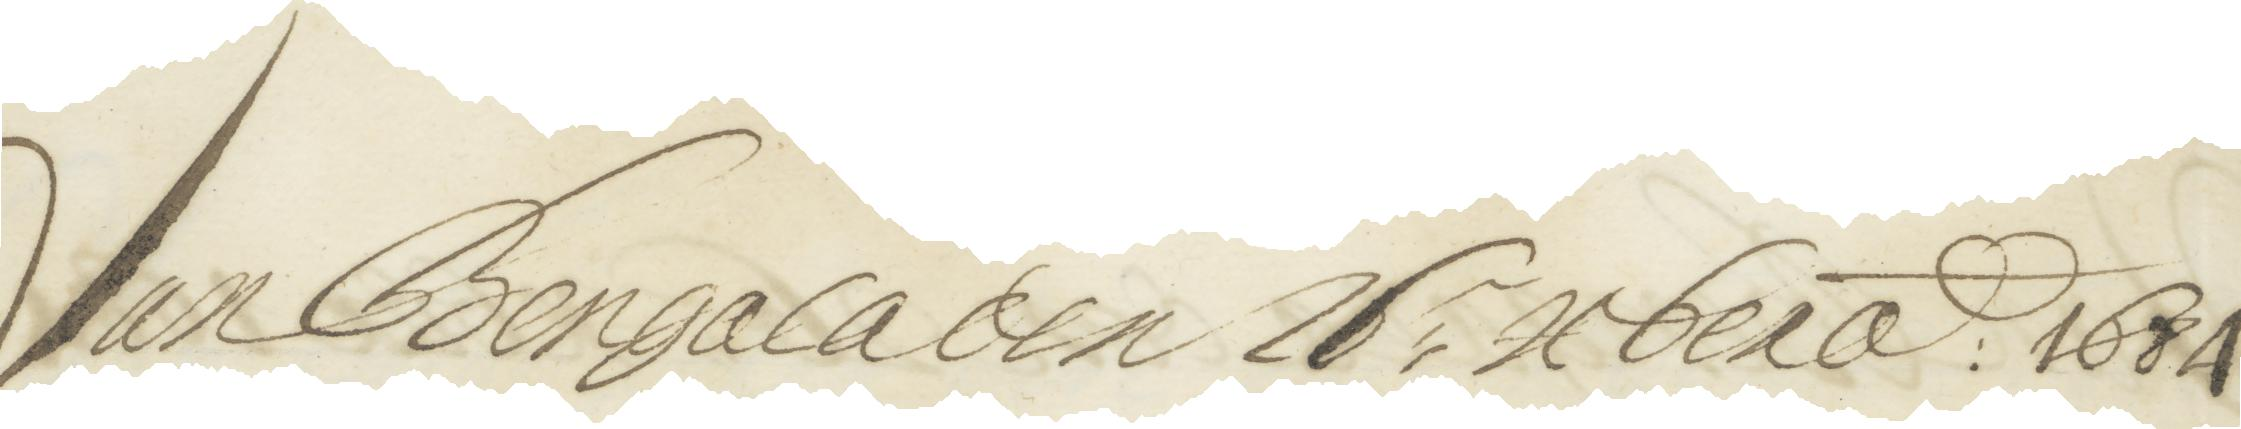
Van Bengala den 26„' xber a:' 1684
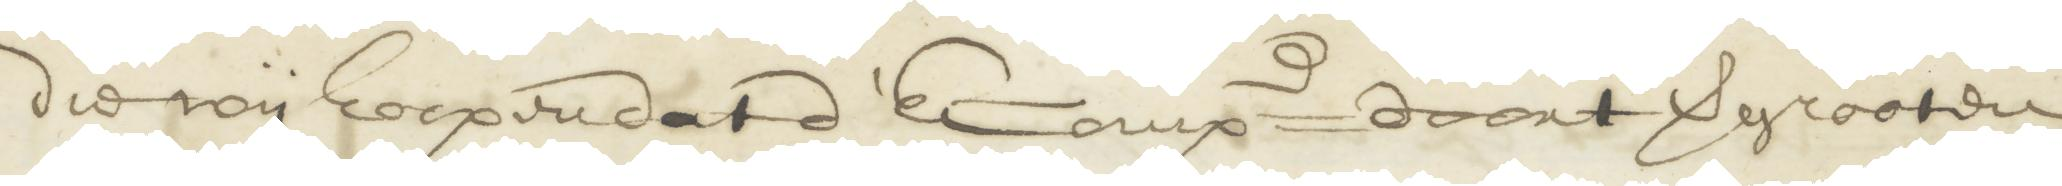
die wij hoopen dat d’EComp=e door 't vergrooten
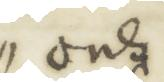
„ ons
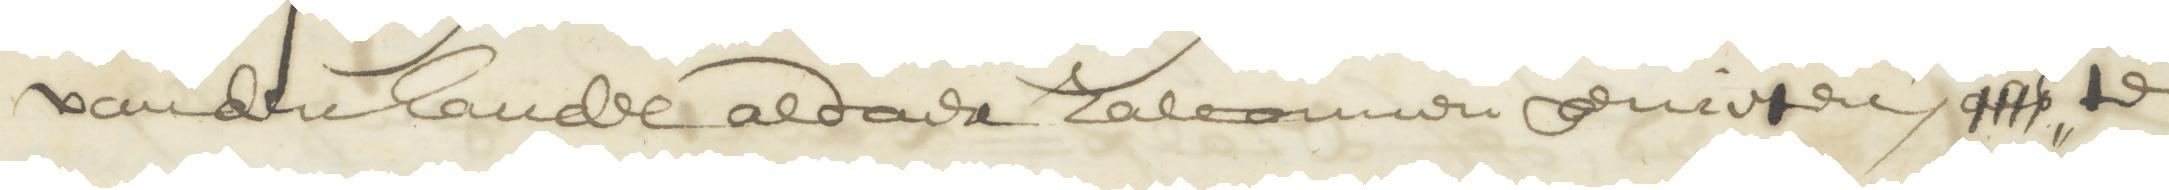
van den handel aldaer zal connen genieten als „ te
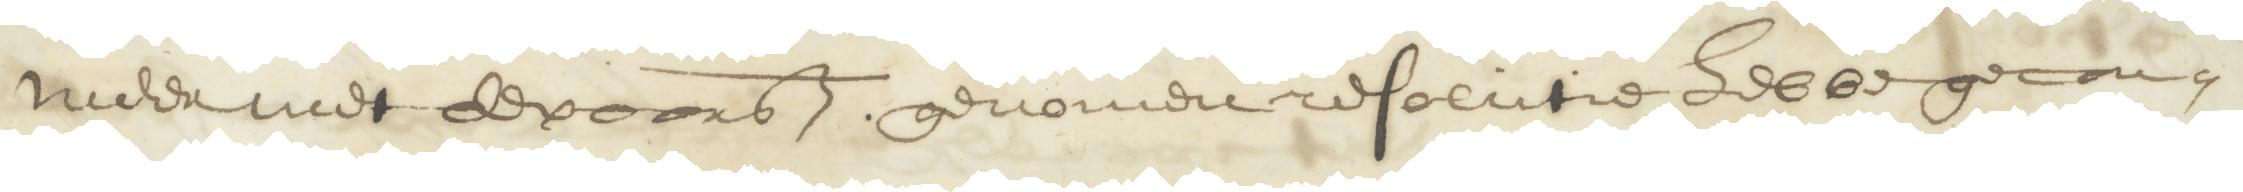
meer met de voors. genomen resolutie hebbe gecon=
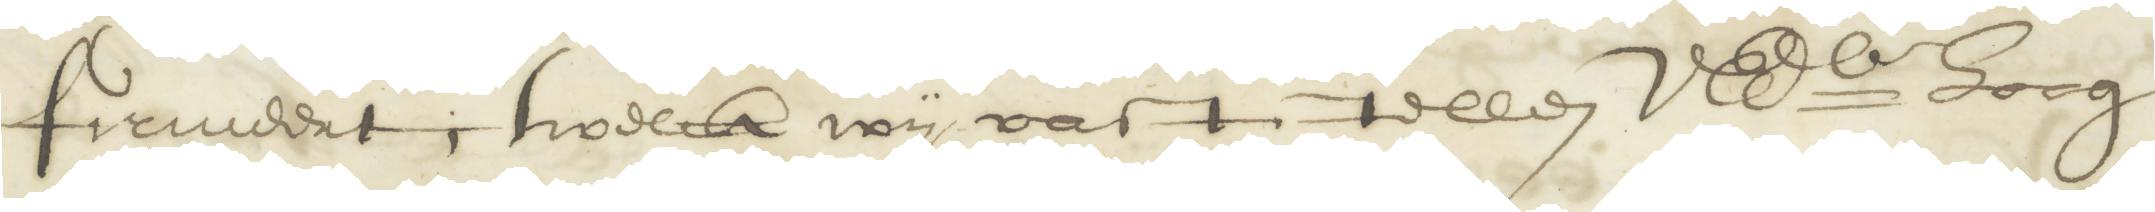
firmeert; twelck wij vast stellen VEd=le hoog
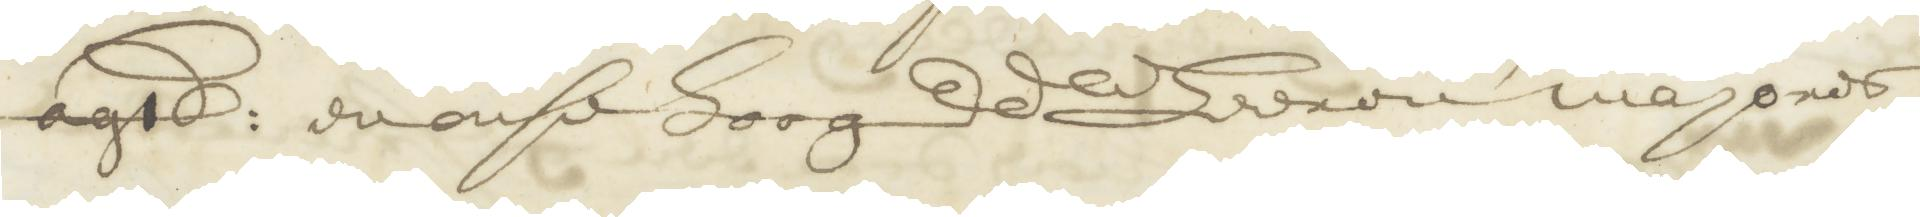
agtb: en onse hoog Ed=le heeren majores
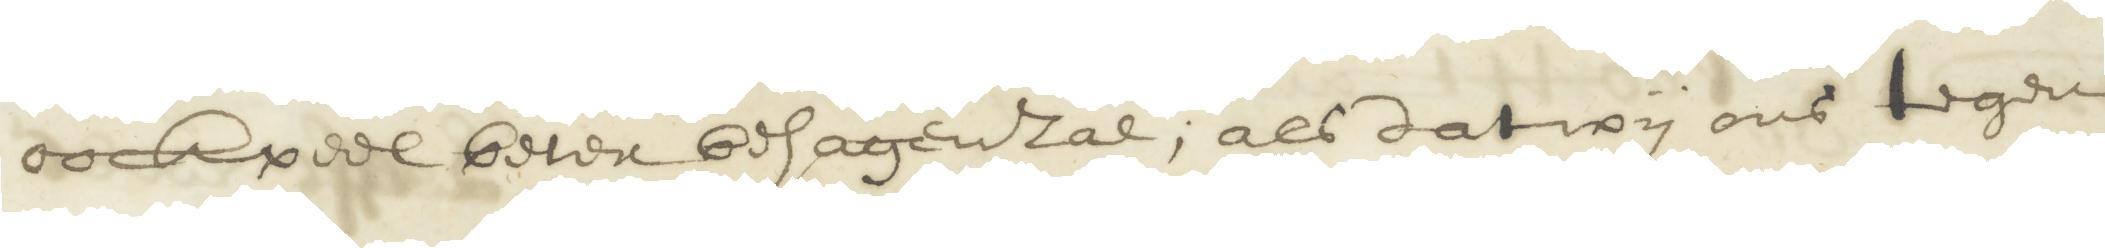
oock veel beter behagen Zal; als dat wij ons tegen
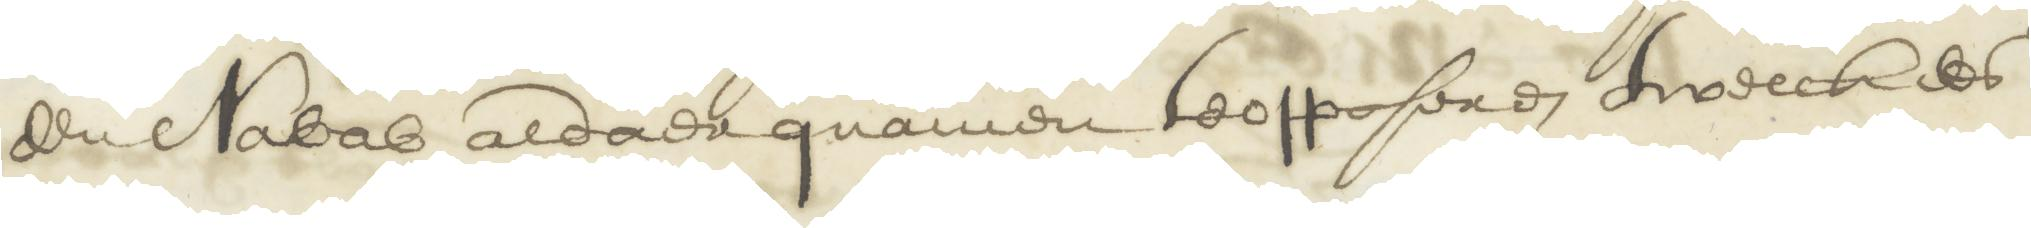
den Nabab aldaer quamen te opposeren, 'twelck des
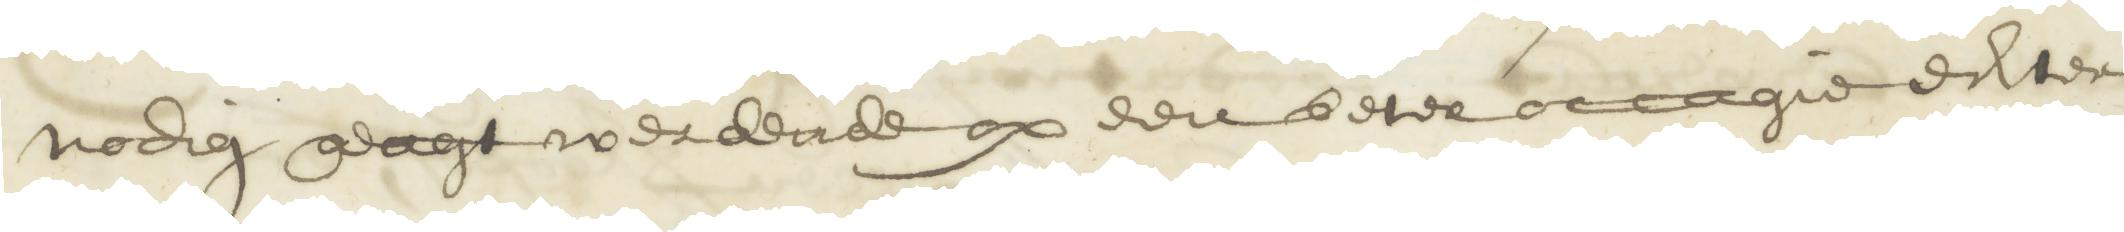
nodig geagt werdende op een beter occagie echter
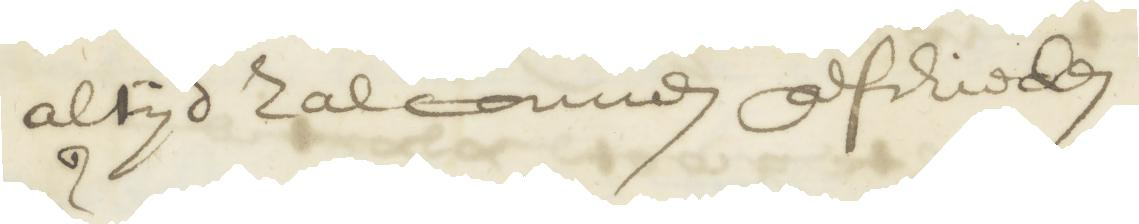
altijd zal connen geschieden
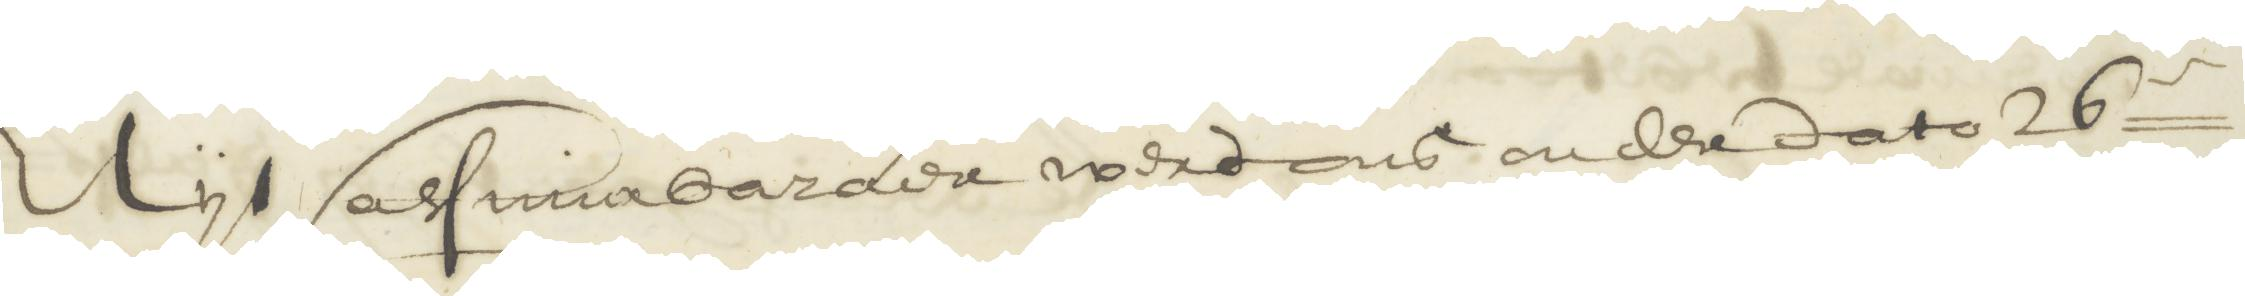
Uijt Cassimabazaer werd ons onder dato 26=e
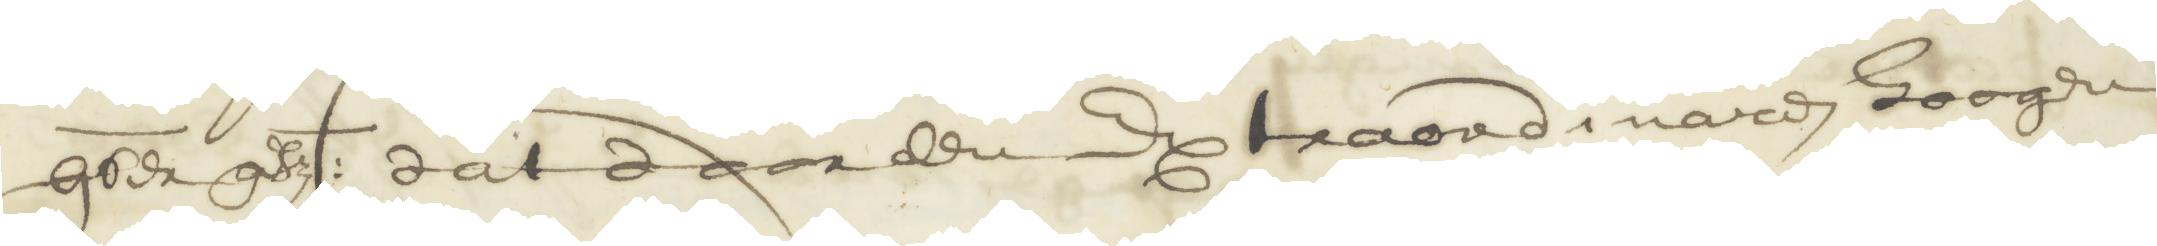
9ber gesz: dat door den Extraordinaren hoogen
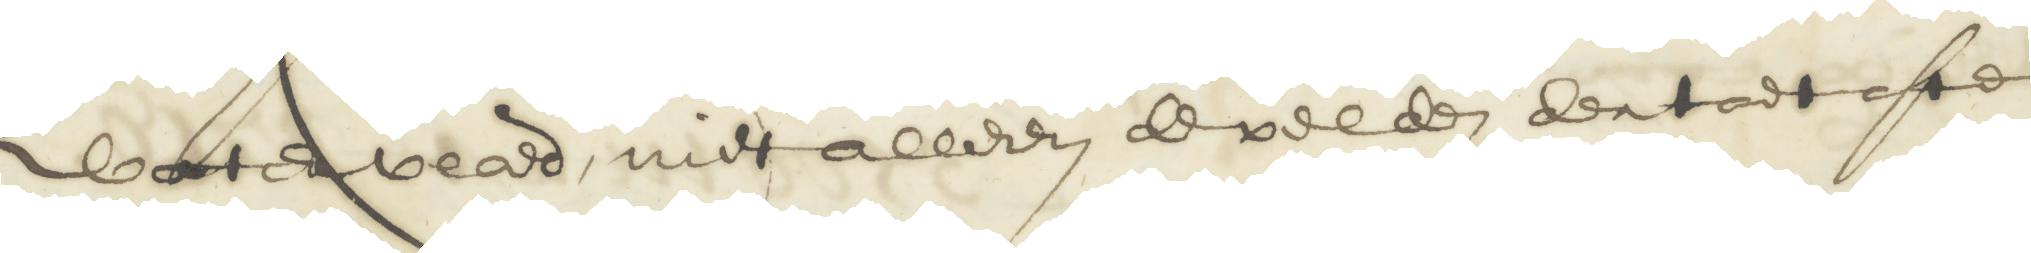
watervloed, niet alleen de velden der toet ofte
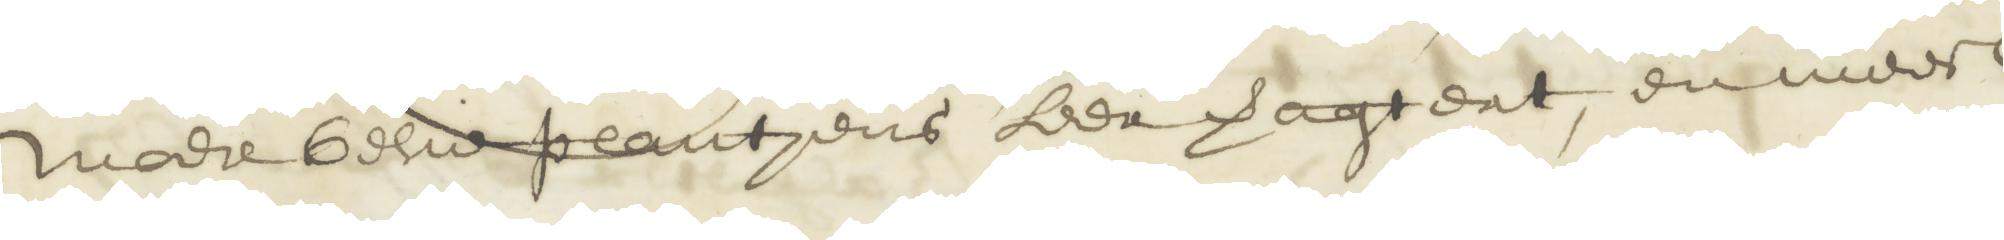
moerbesie plantjens seer veragtert, en meest
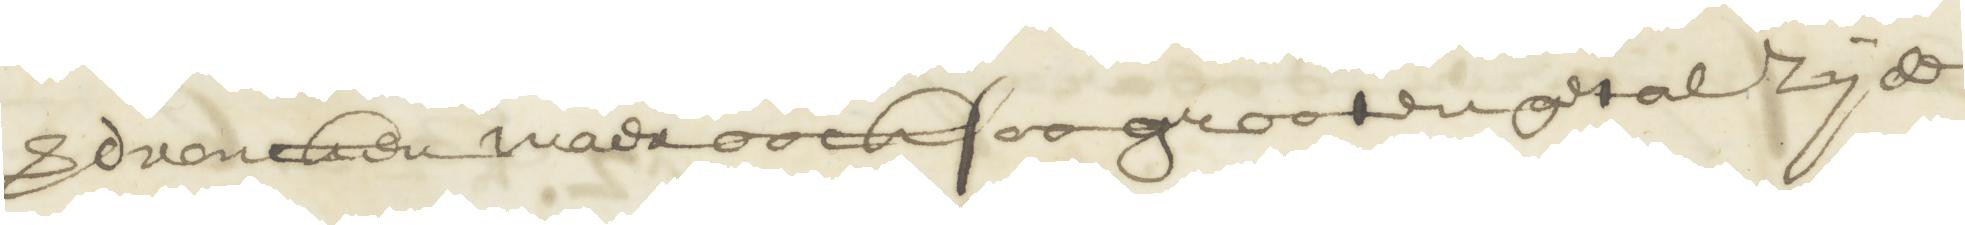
verdroncken maer oock soo grooten getal Zijde
